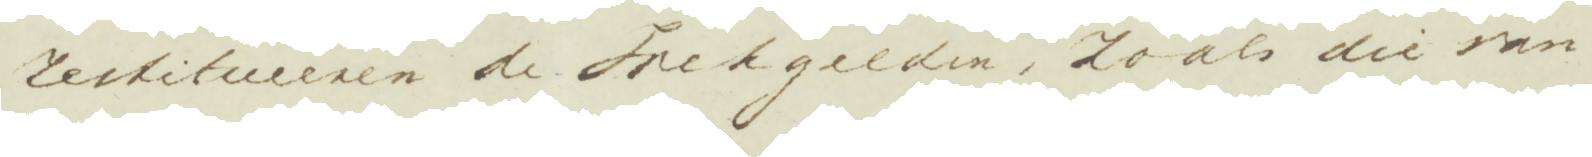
restitueeren de Trekgelden, zoals die van
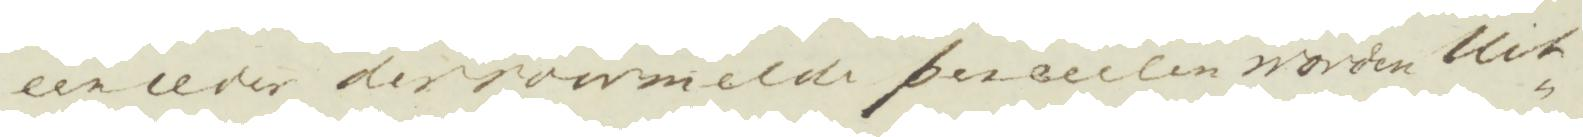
een ieder der voormelde perceelen worden Uit„
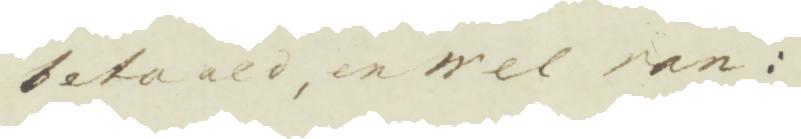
betaald, en wel van :
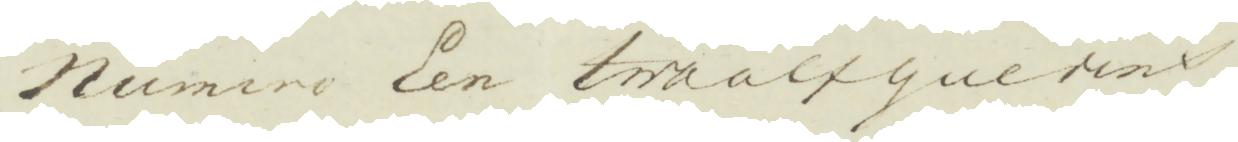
Numero Een twaalf guldens
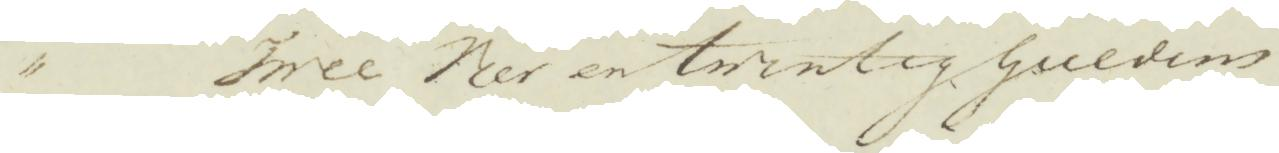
„ Twee Vier en twintig guldens
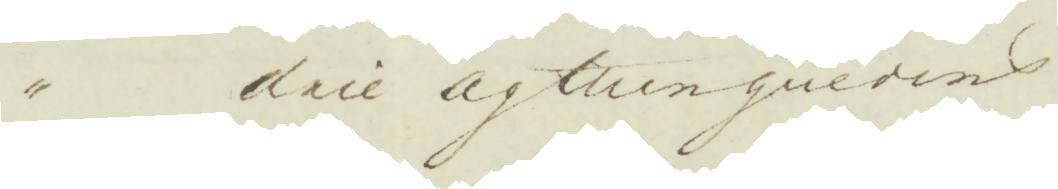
„ drie agttien guldens
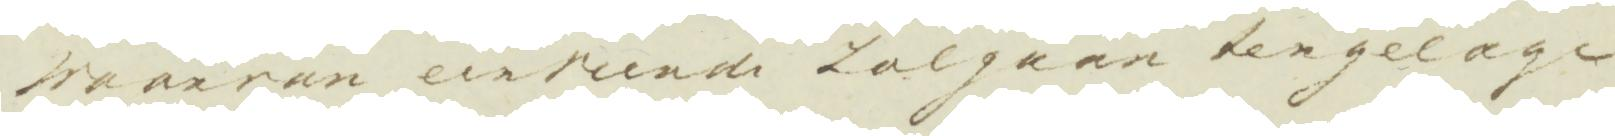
waar van een vierde Zal gaan ter gelage
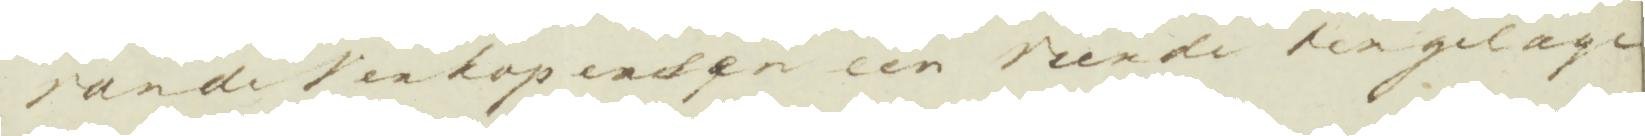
van de Verkopers en een vierde ter gelage
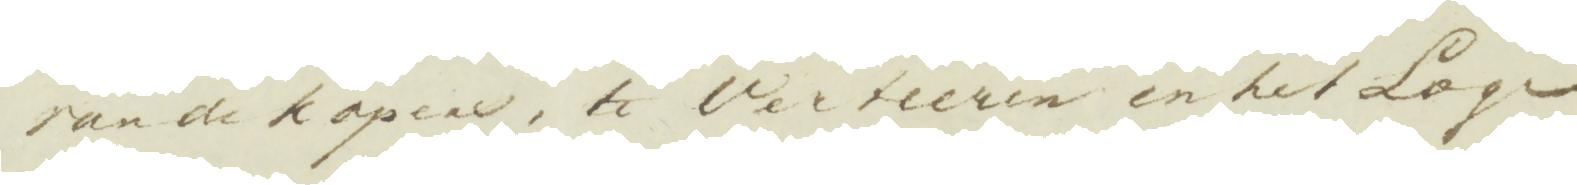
van de kopen, te Verteeren in het Loge
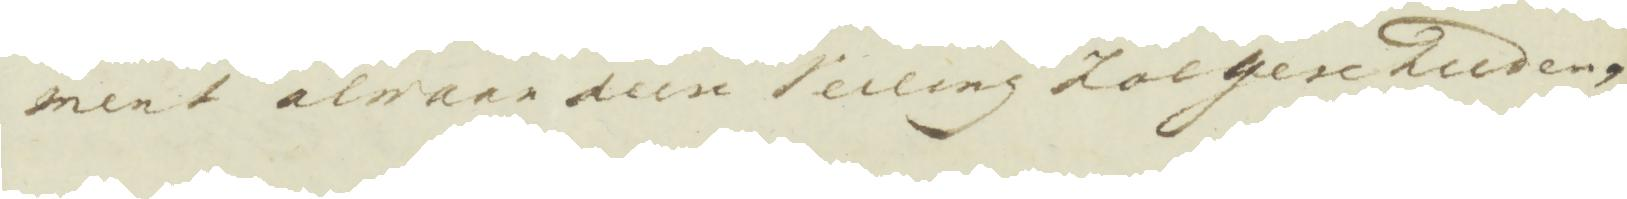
ment alwaar dien Veiling zal geschieden,
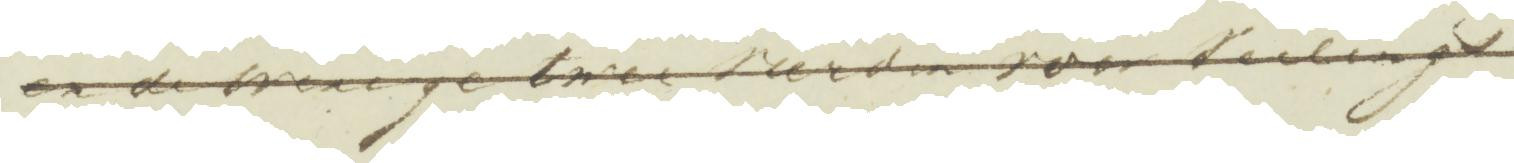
en de overige twee vierden voor Veilinge
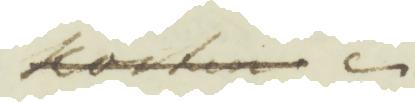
kosten
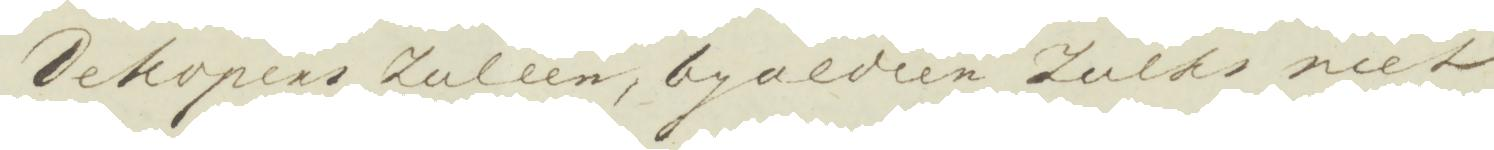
De kopers zullen, by aldien zulks niet
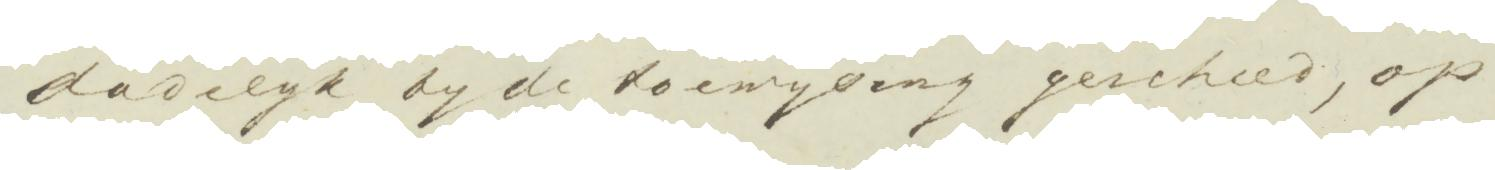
dadelyk by de toewysing geschied, op
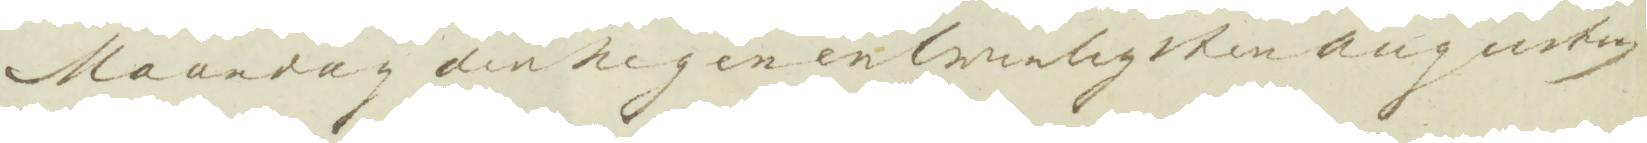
Maandag den negen en twintigsten augustus
